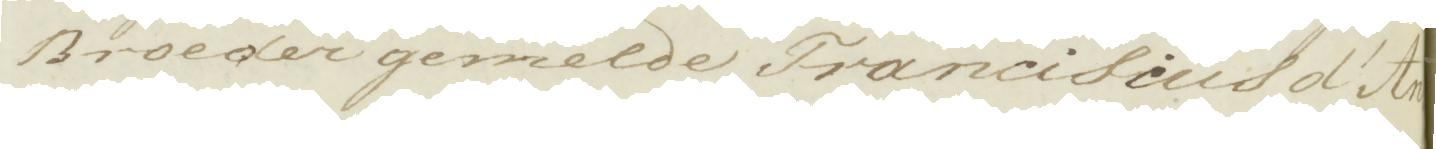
Broeder gemelde Franciscus d'An
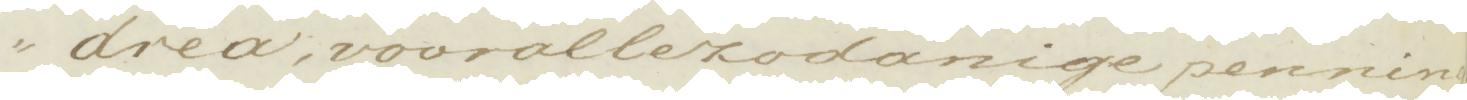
„drea, voor alle zodanige penning
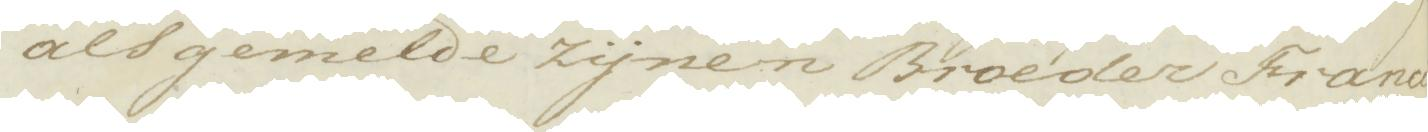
als gemelde zijnen Broeder Franci
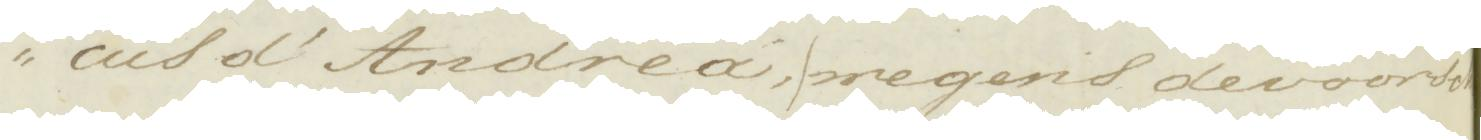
„ cus d' Andrea, / wegens de voorsch
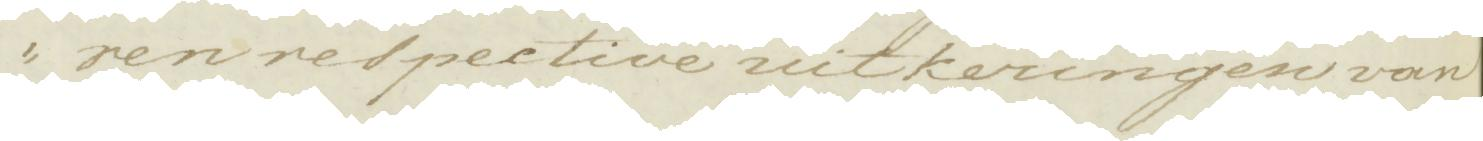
„ ven respective uitkeringen van
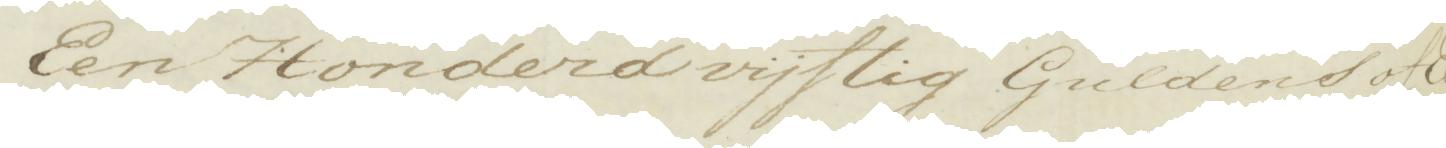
Een Honderd vijftig Guldens of Ee
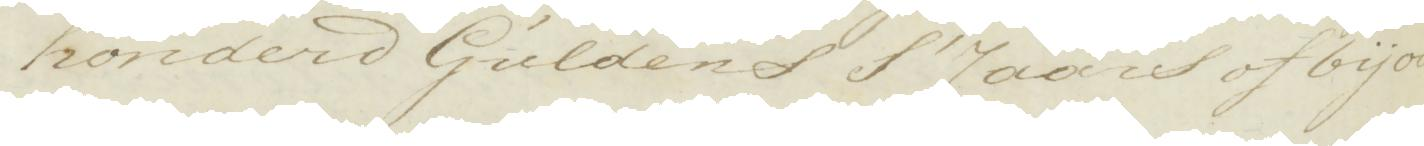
honderd Guldens s' Jaars of bij o
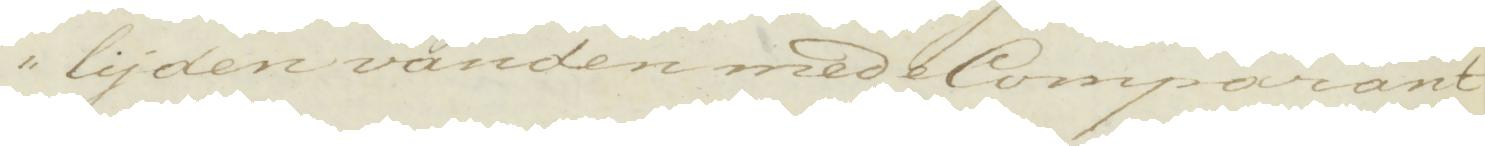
„lijden van den mede Comparant
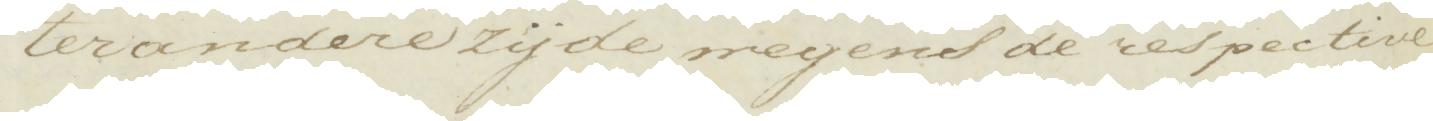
ter andere zijde wegens de respective
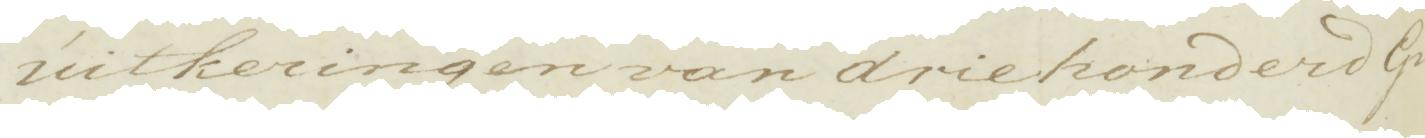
uitkeringen van drie honderd G
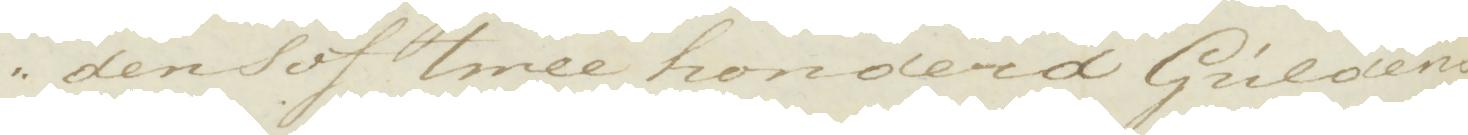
„ dens of twee honderd Guldens
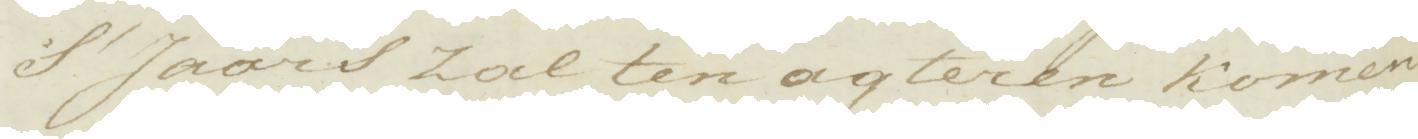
s’ Jaars zal ten agteren komen
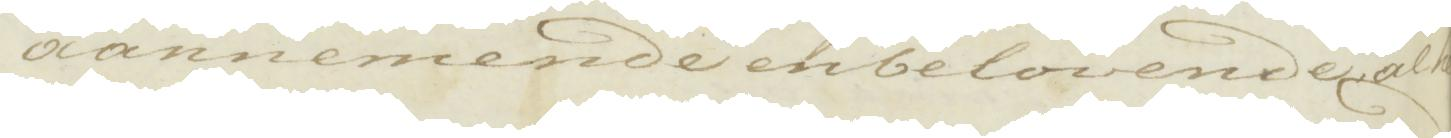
aannemende en belovende, al h
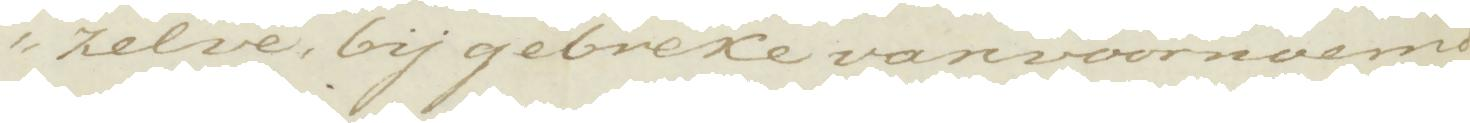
„ zelve, bij gebreke van voornoemde
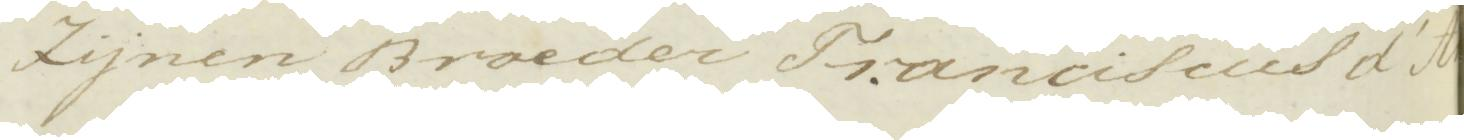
Zijnen Broeder Franciscus d’ A
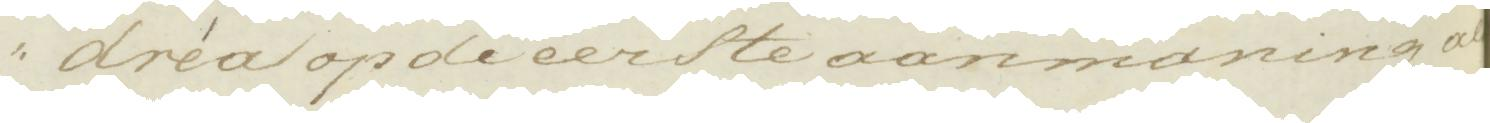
„ dréa op de eerste aanmaning al
